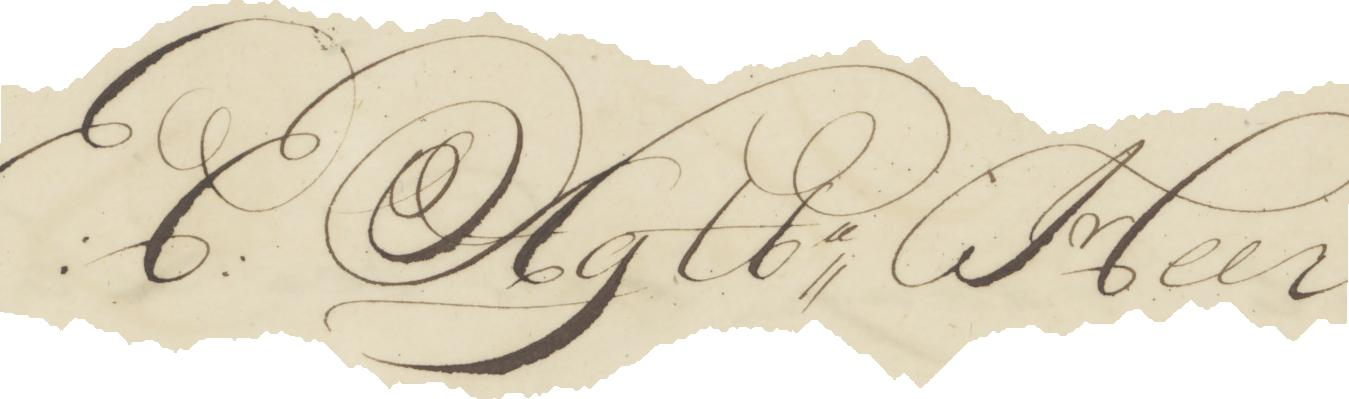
E: Agtb„r Heer
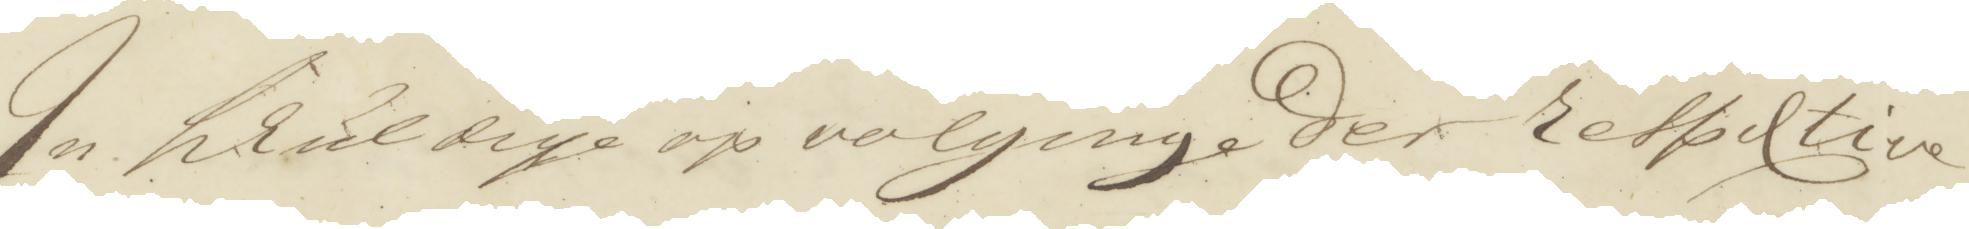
Jn schuldige op volginge der respective
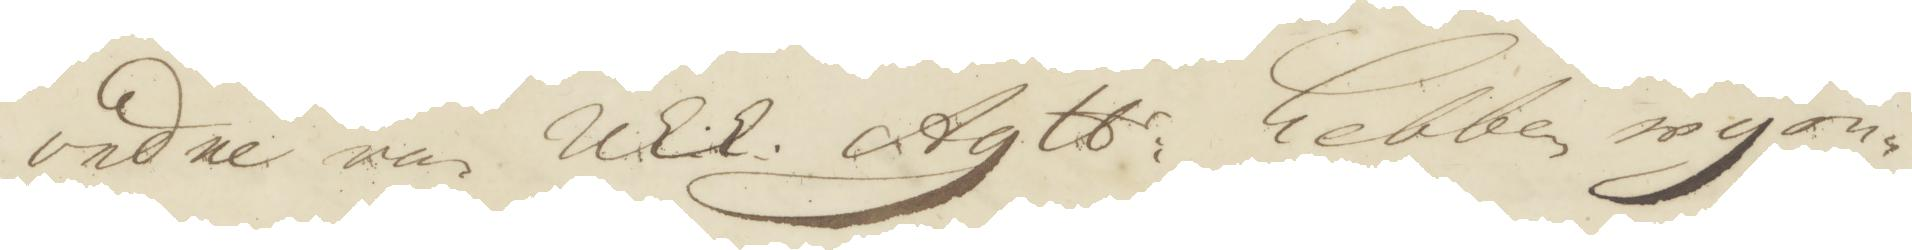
ordre van UE:E: Agtb:r hebben wij on„
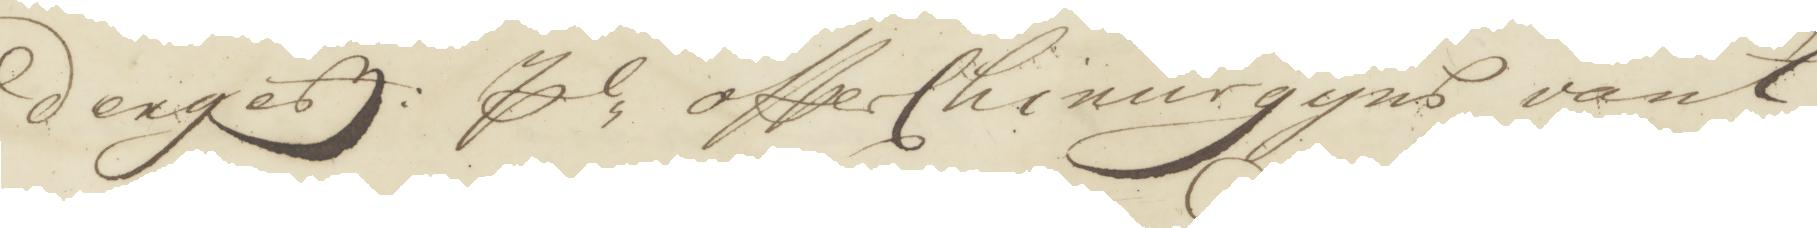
dergesz: p„l opper Chirurgijns van ’t
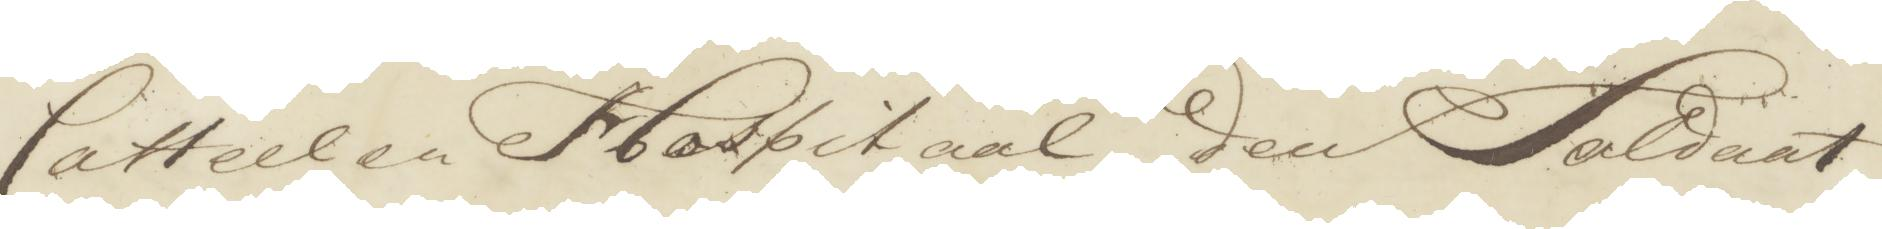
Casteel en Hospitaal den Soldaat
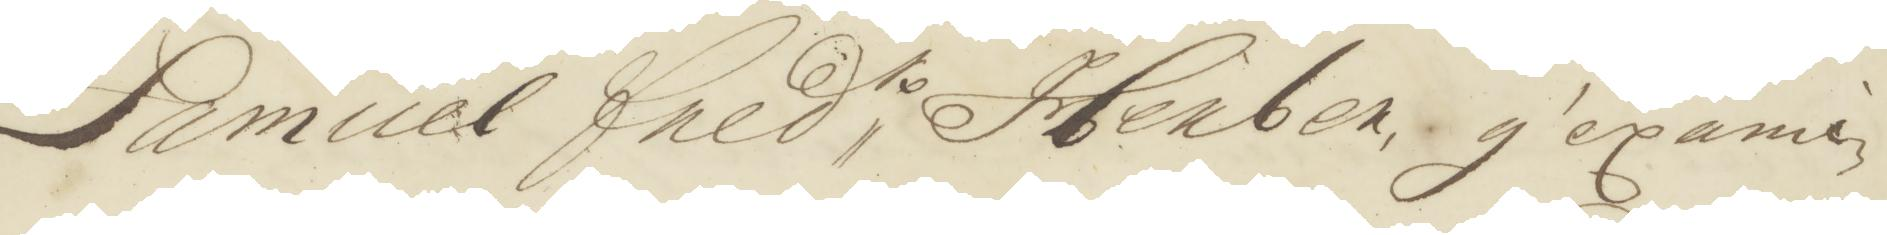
Samuel Fred„k Herber, g’exami
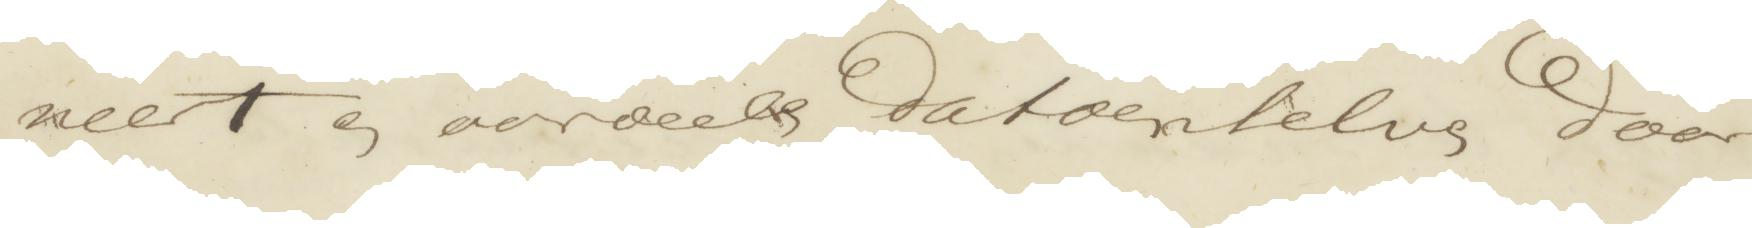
neert en oordeelen dat een selven door
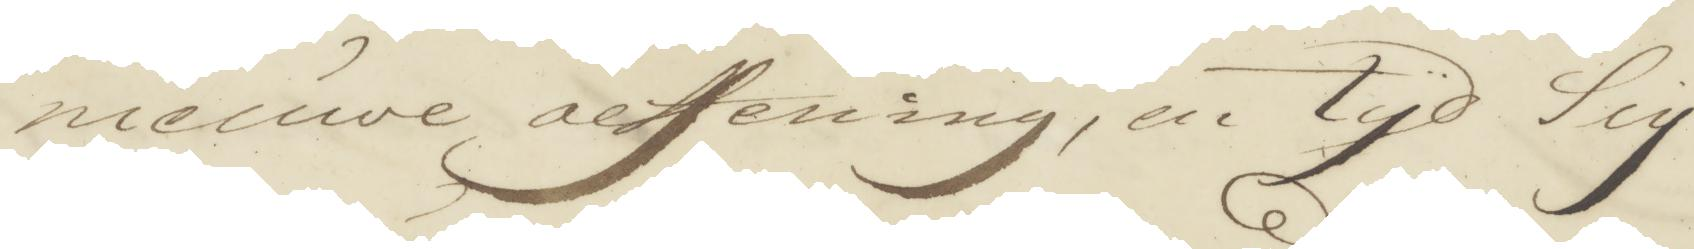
nieuwe aeffening, en tijd sig
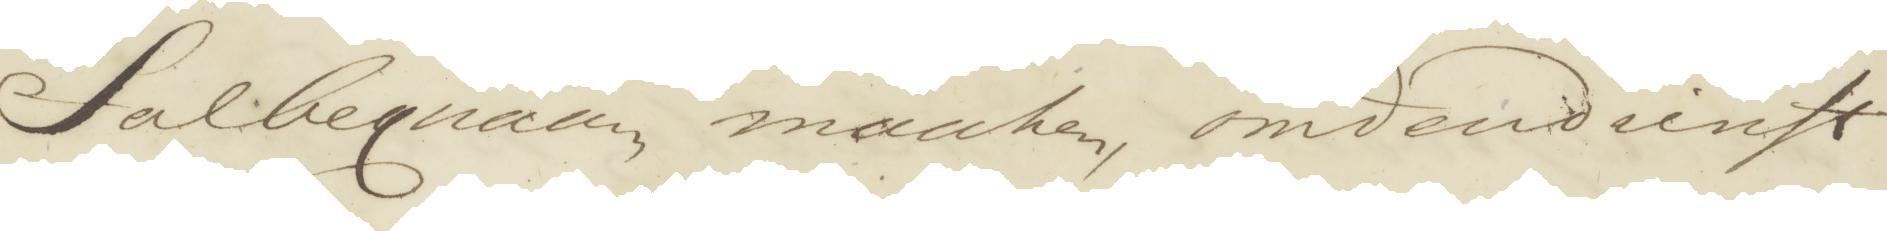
sal bequaam maaken, om den dienst
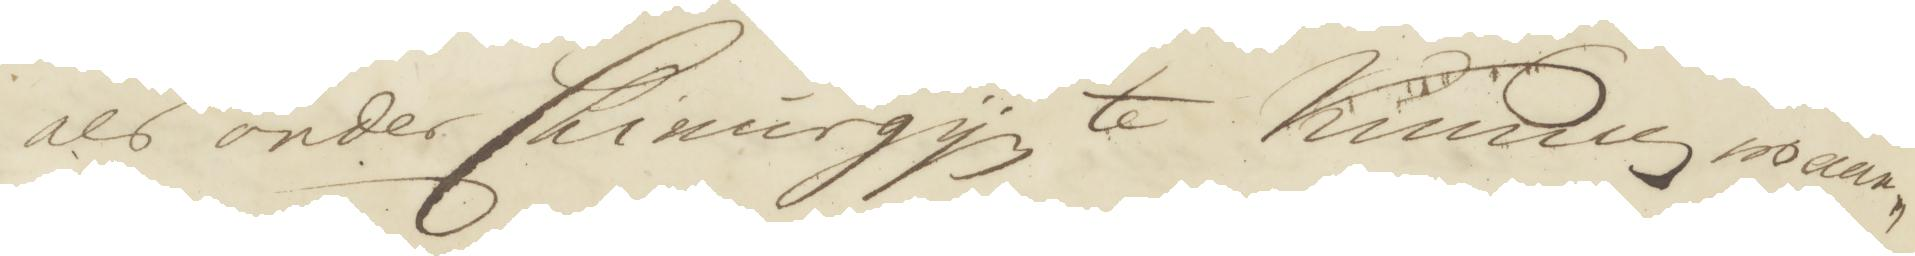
als onder Chirurgijn te kunnen waar„
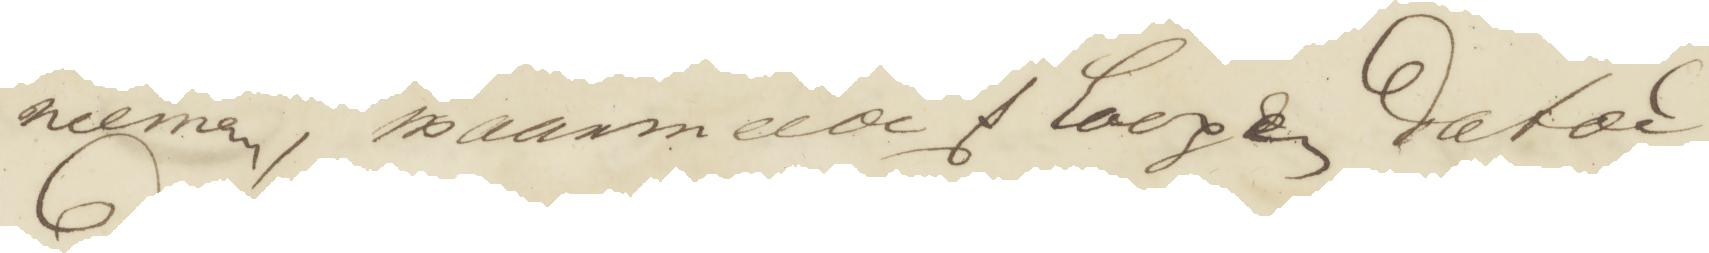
neemen, waarmeede verhoepen dat de
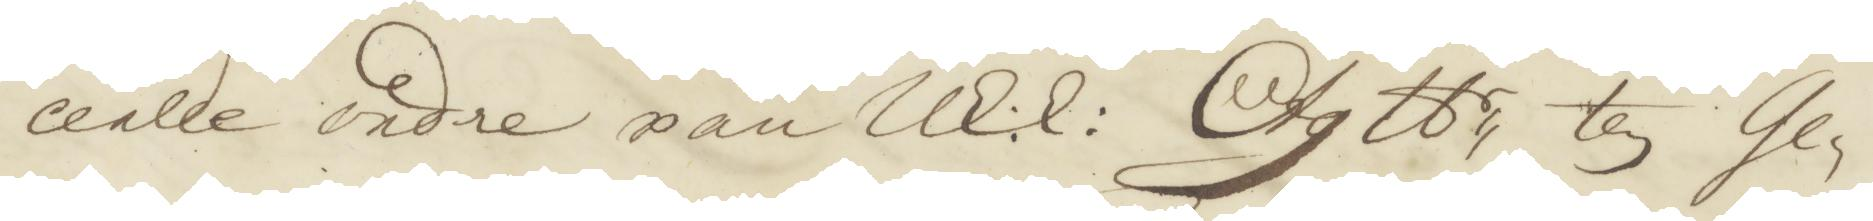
eerde ordre van UE:E: Agtb„r ten ge
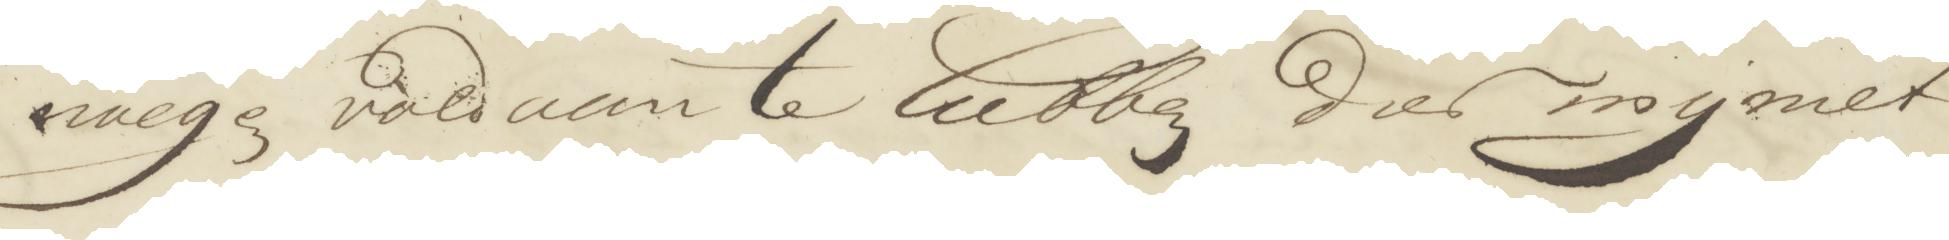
noegen voldaan te hebben dies wij met
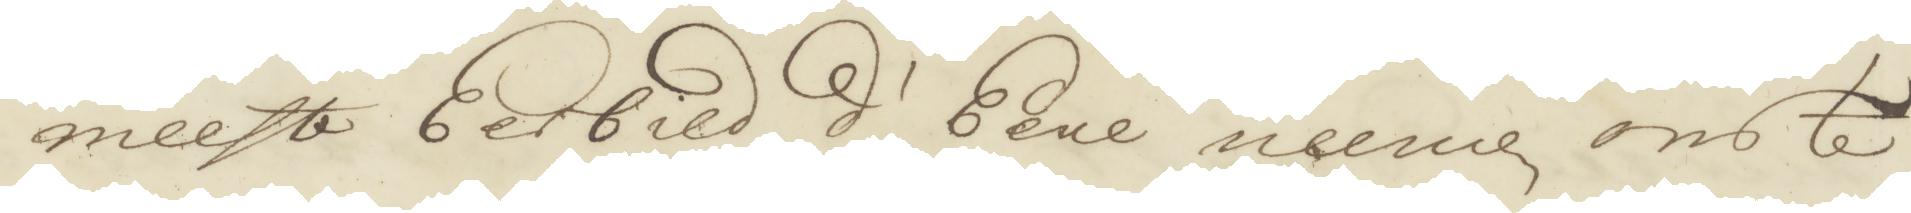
meeste Eerbied d’ Eere neemen ons te
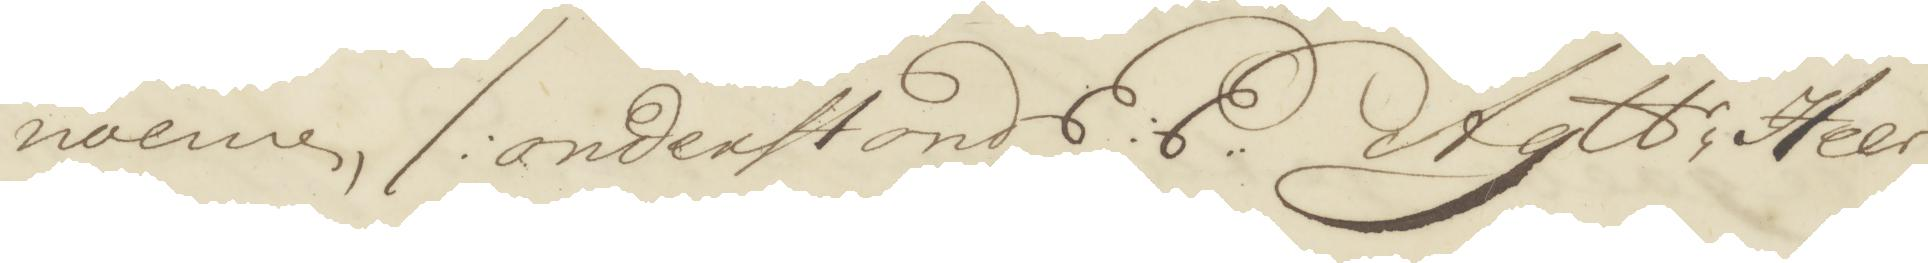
noemen, /:onderstond E: E: Agtb„r Heer
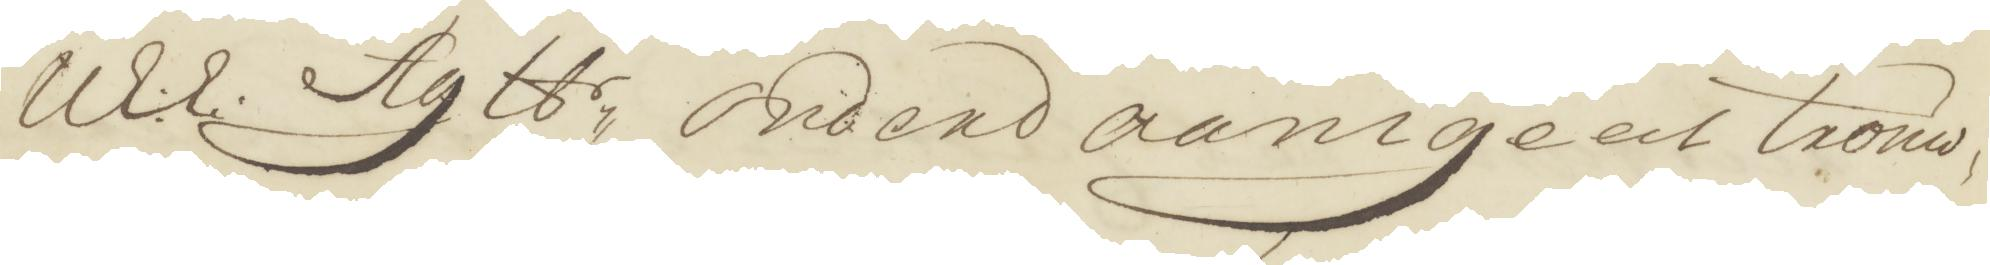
UE:E: Agtb„r onderdaanige en trouw„
